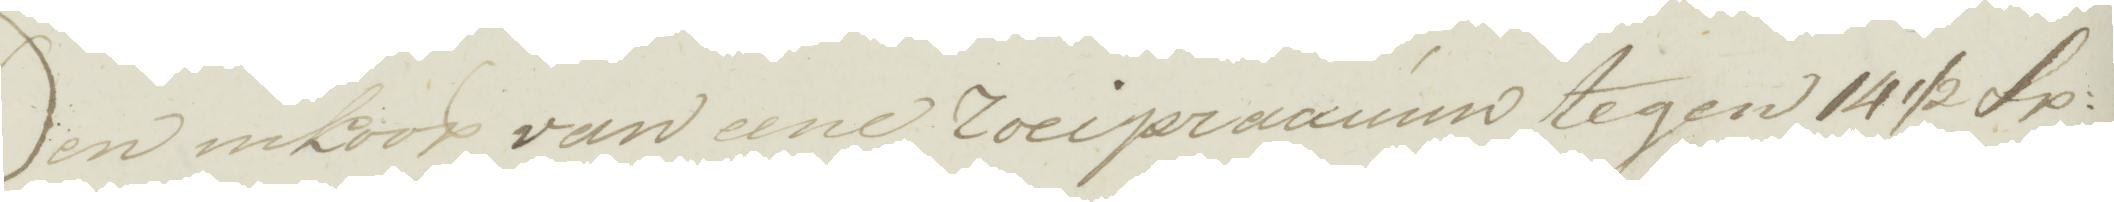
Den inkoop van eene roeipraauuw tegen 14½ Sp:
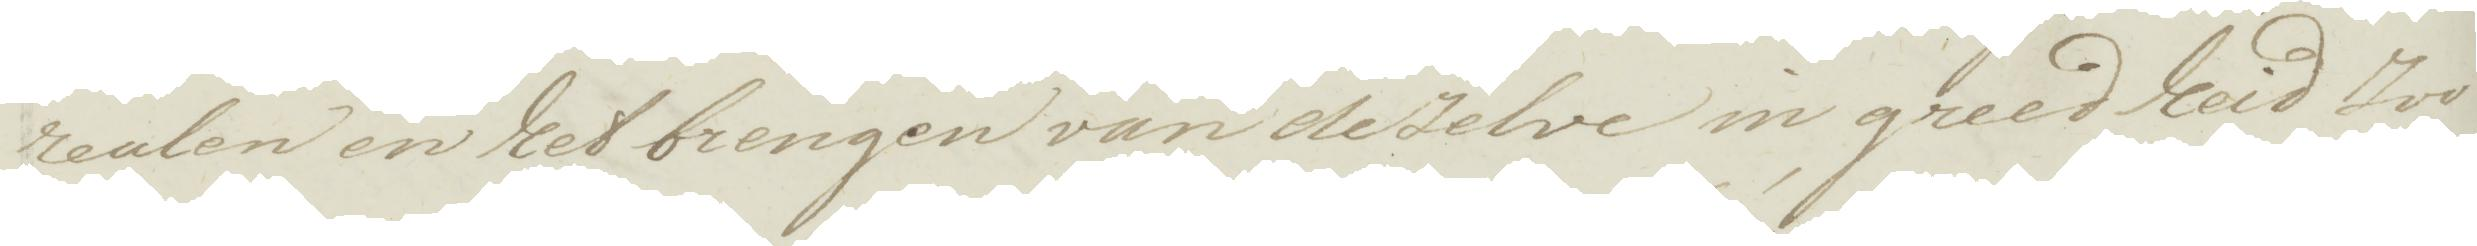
realen en het brengen van dezelve in greedheid Zoo
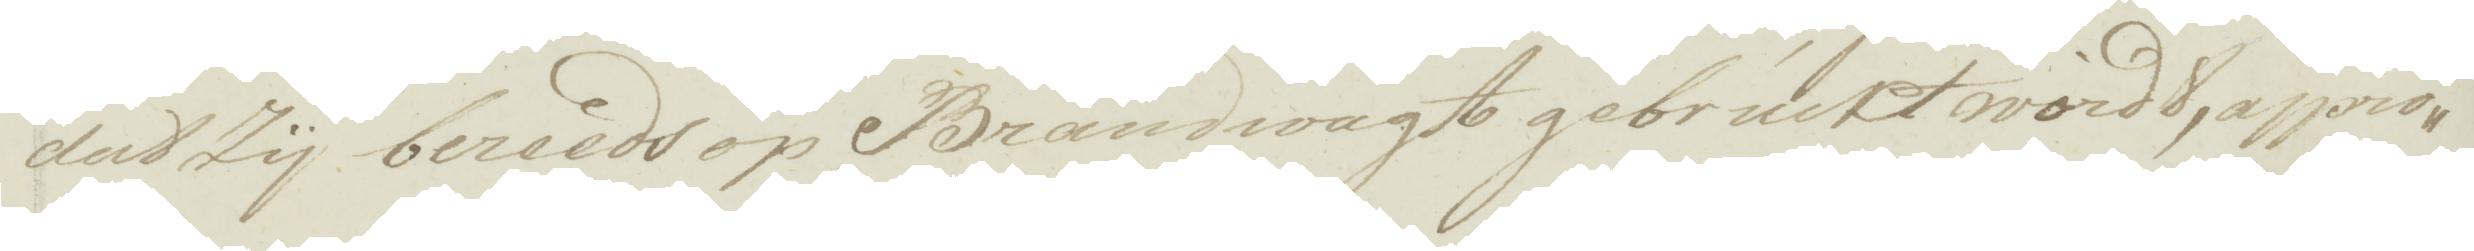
dat Zij bereeds op Brandwagte gebruikt wordt, appro„
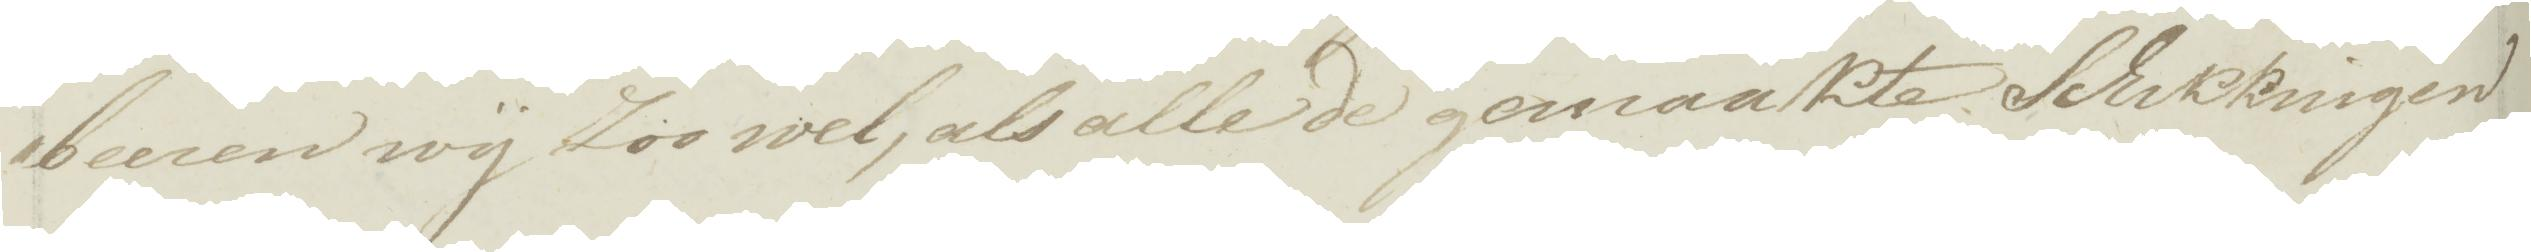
„beeren wij Zoo wel, als alle de gemaakte Schikkingen
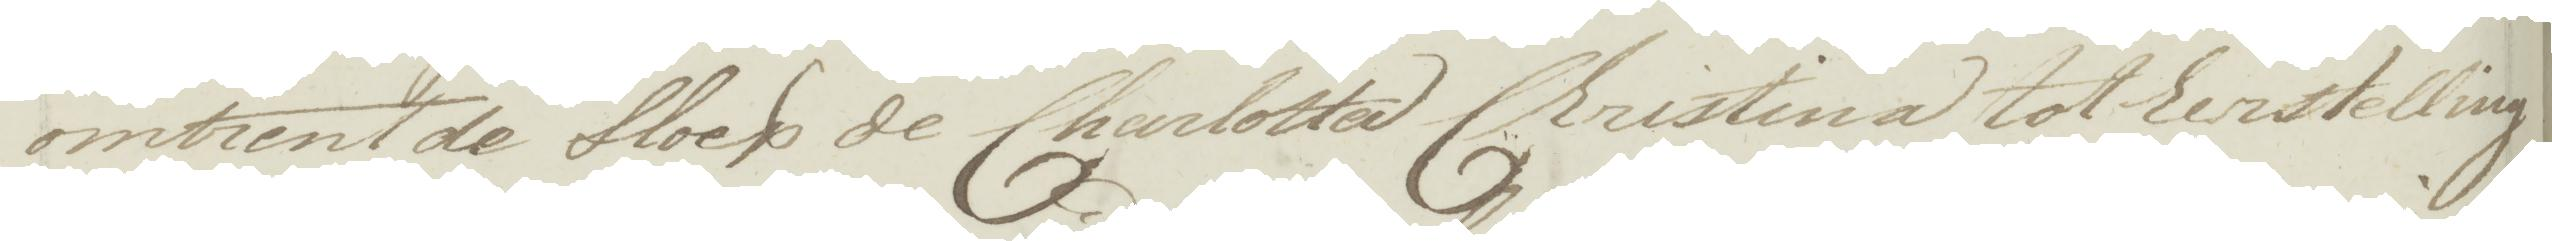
omtrent de Sloep de Charlotta Christina tot Eerstelling
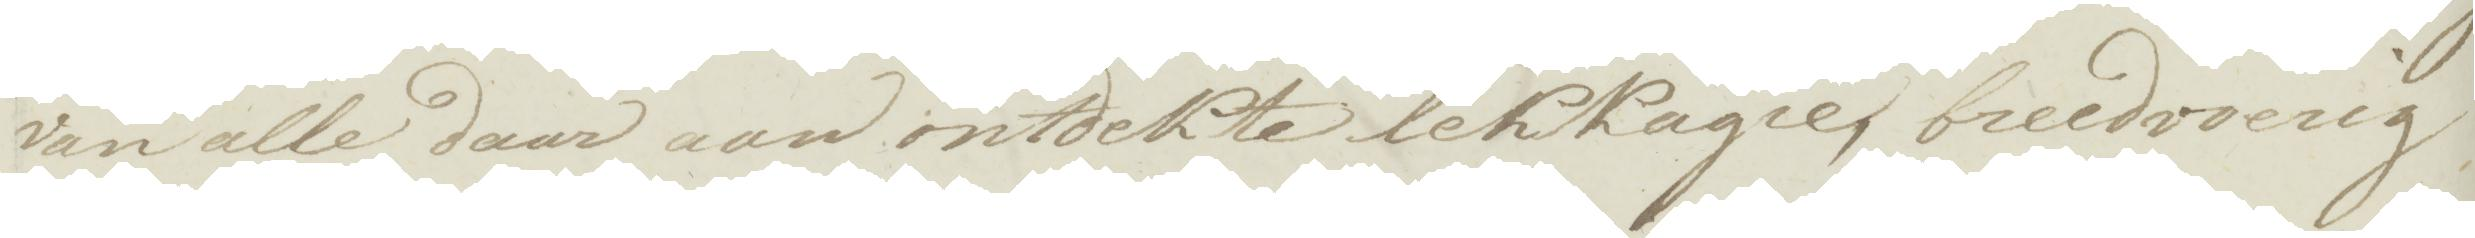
van alle daar aan ontdekte lekkagie breedvoerig
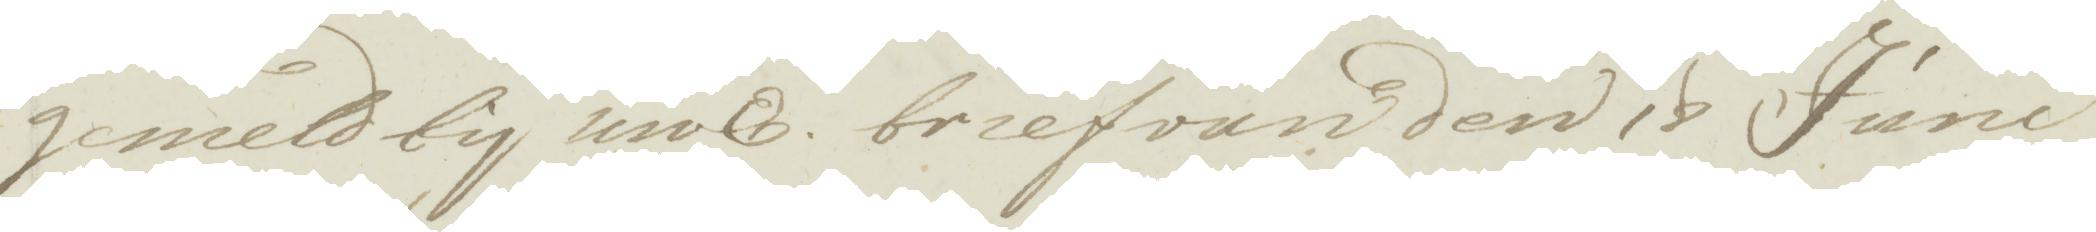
gemeld bij uw E. brief van den 18 Juni
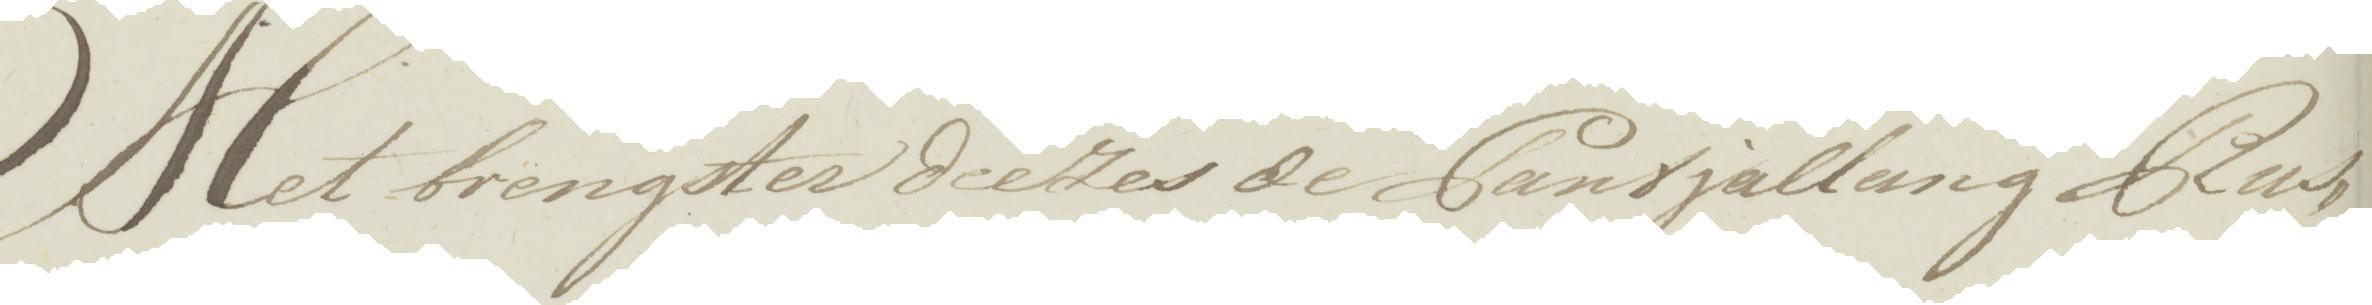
Het brengster deezes de Pantjallang Rus
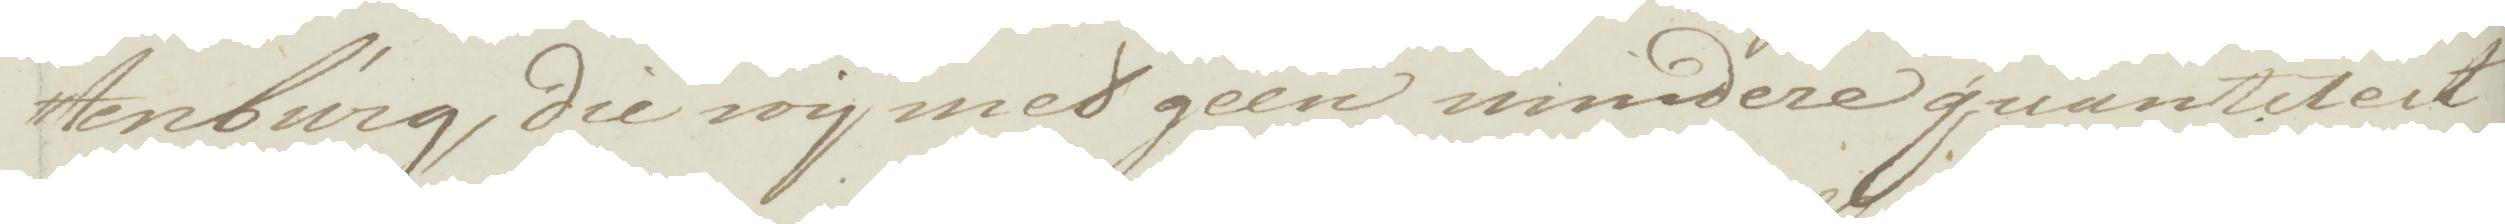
„tenburg, die wij met geen mindere quantiteit
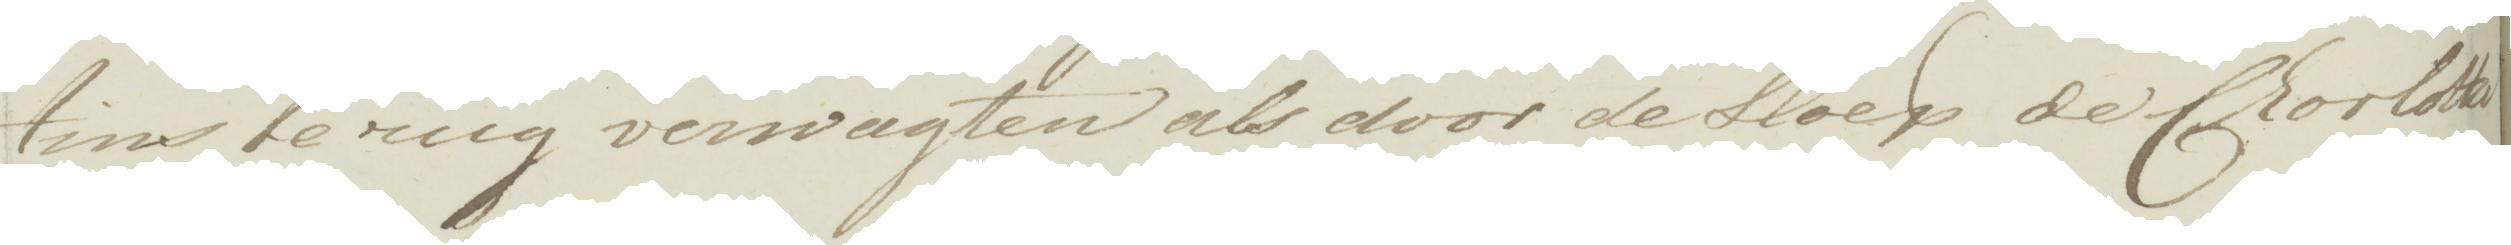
tins terug verwagten als door de sloep de Chorlotte
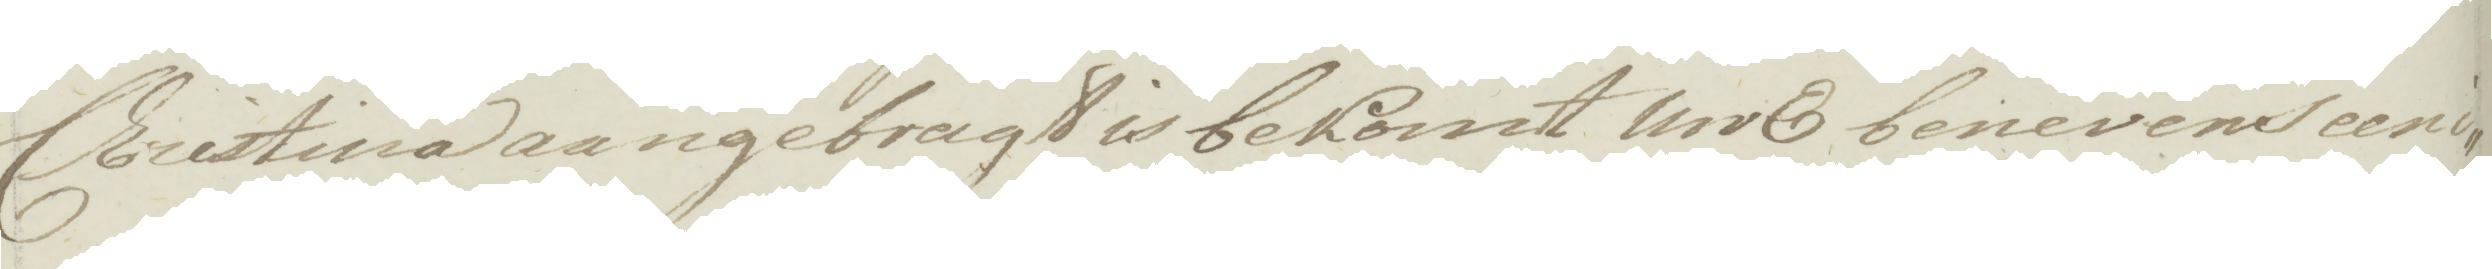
Christina aangebragt is bekomt uw E benevens een
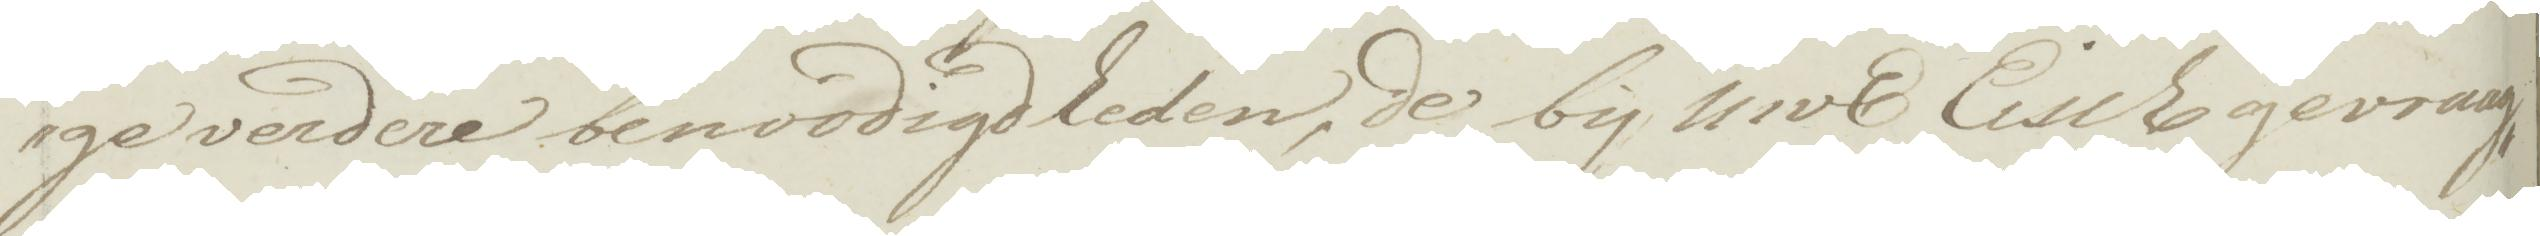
„geverdere benoodigdheden, de bij uw E Eisch gevraag„
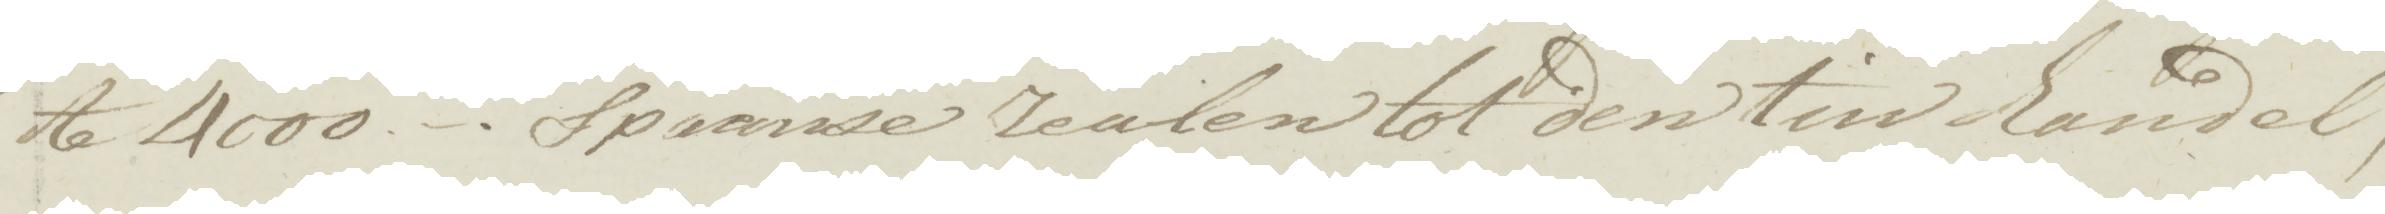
te 4000.–. Spaanse realen tot den tin handel.
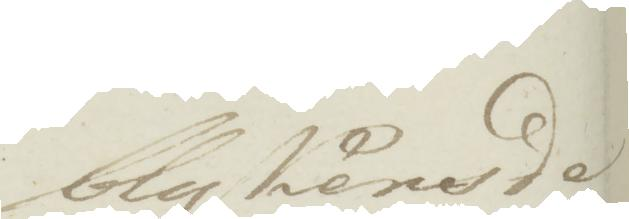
blykens de
